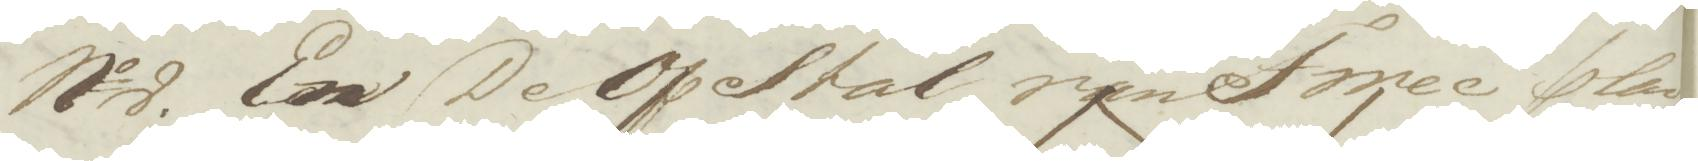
N=o 8. En De Op Stal van Twee pla
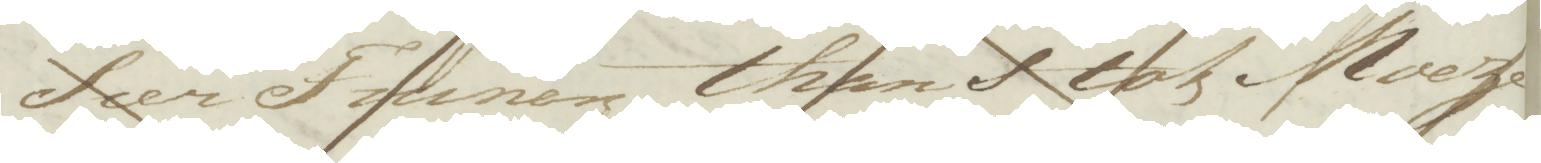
sier Tuinen, Thans tot Moeze
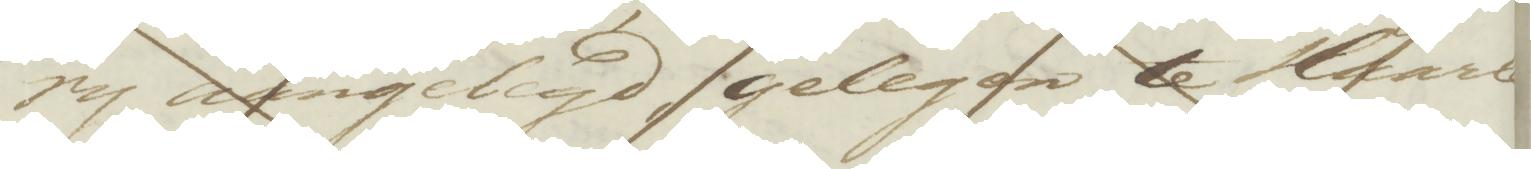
ry aangelegd, gelegen te Haar
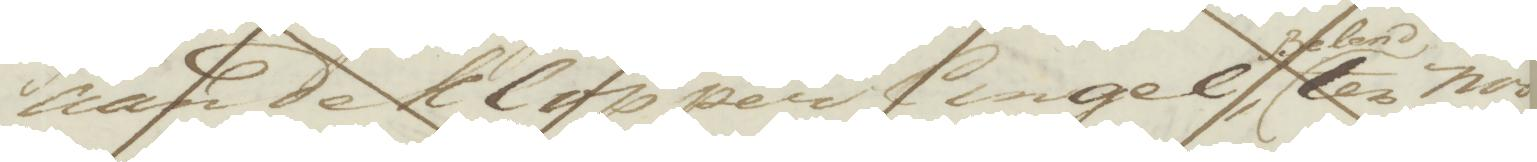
aan de klopper Cingel, Beland ten Noo
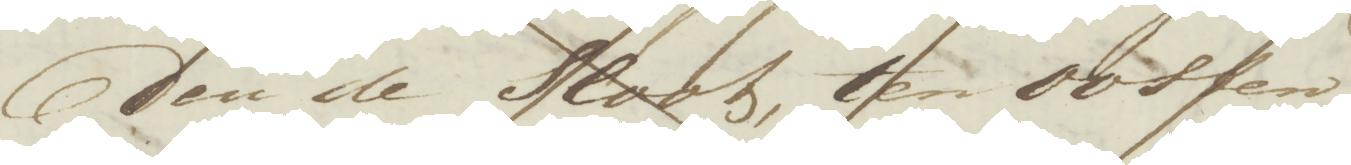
den de sloot, ten oosten
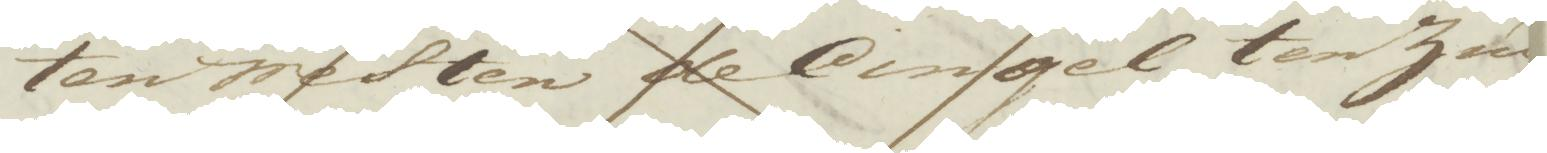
ten westen de cingel, ten zui
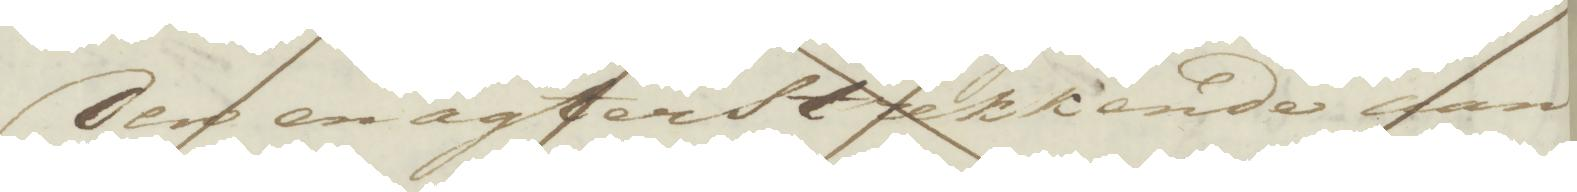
den en agterstrekkende aan
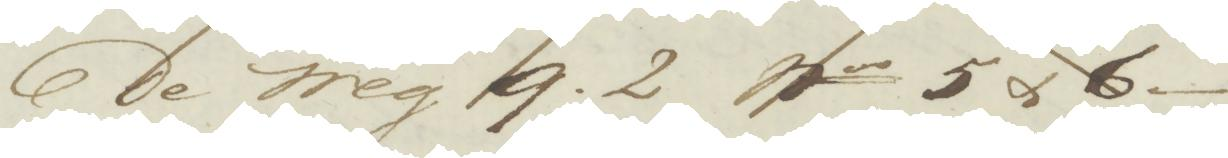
de weg 9.2 N=os 5 & 6.
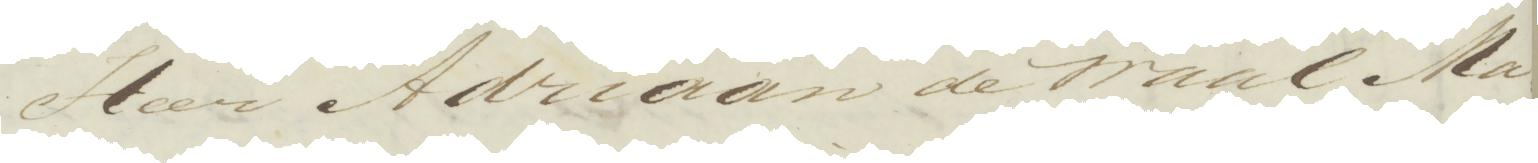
Heer Adriaan de waal Ma
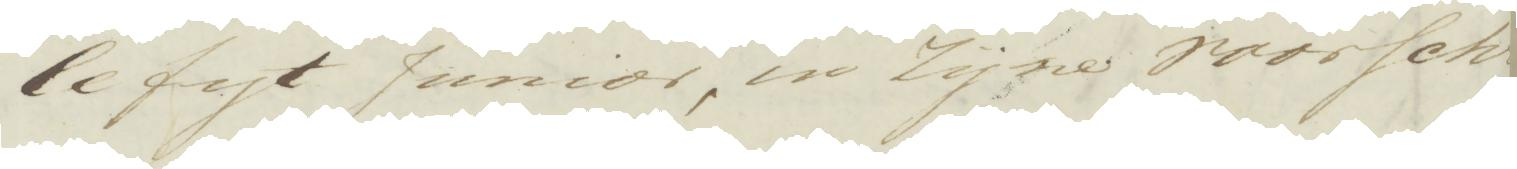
lefyt Junior, in Zijne voorsch
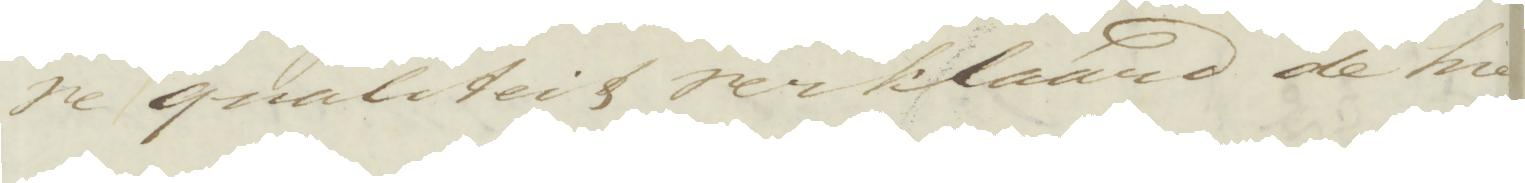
ve qualiteit verklaard de hie
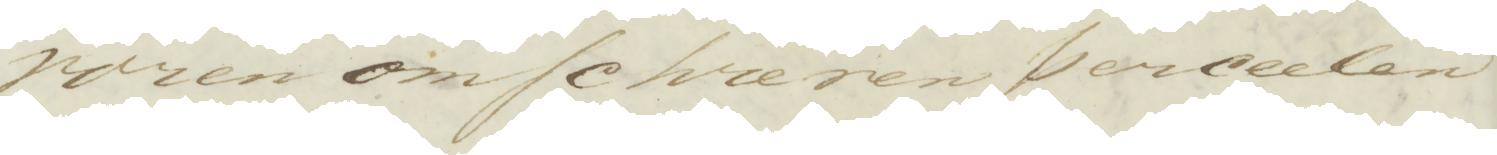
voren omschreven perceelen
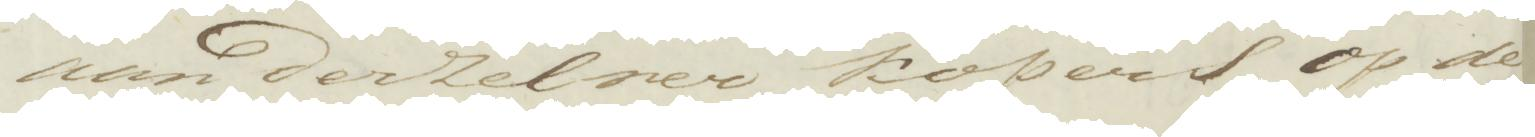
aan derzelver kopers, op de
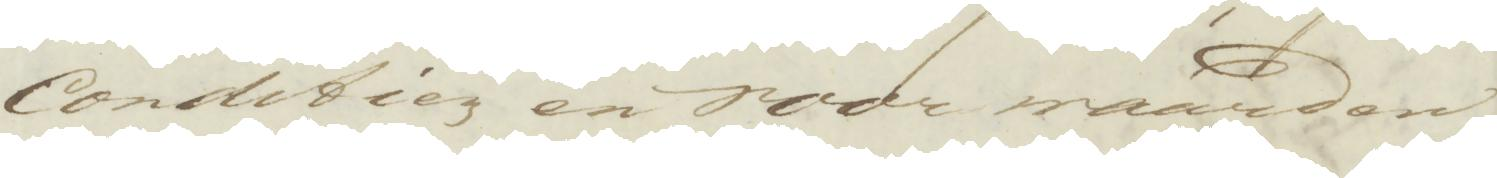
conditien en voor waarden
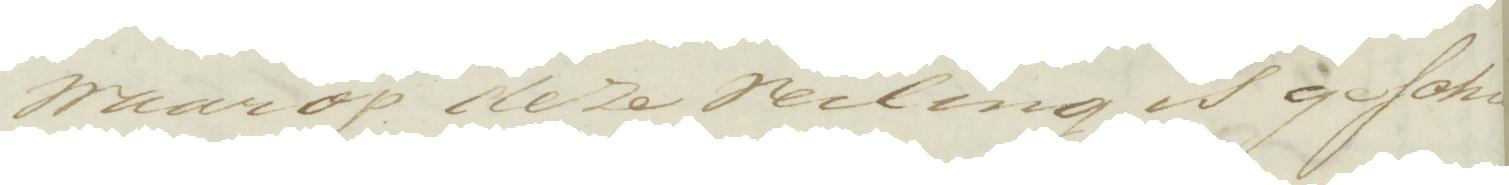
waarop deze veiling is gesch
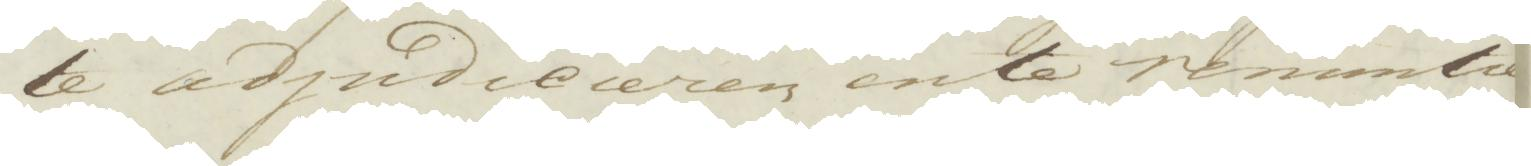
te adjudicieren en te renuntie
